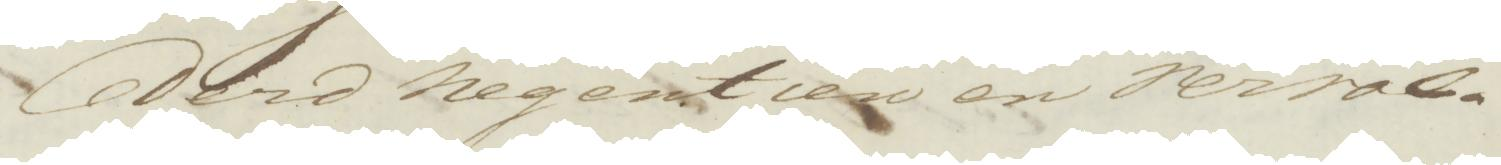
derd negentien en vervol„
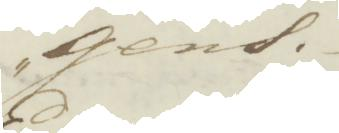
„gens.
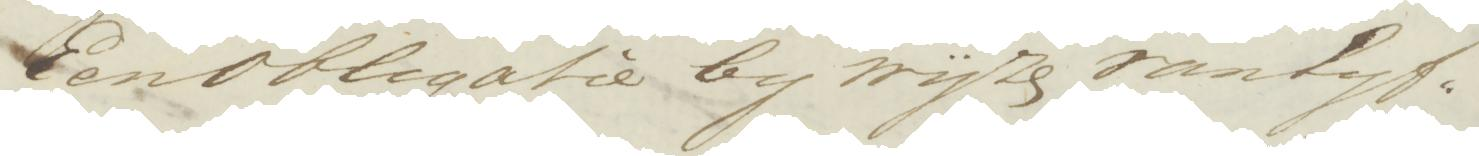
Een obligatie by wijzen van lyf„
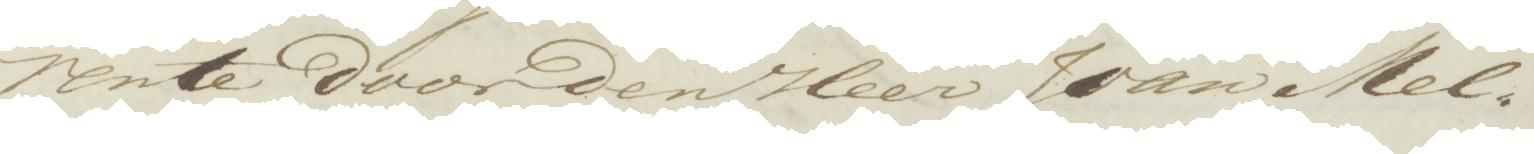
rente door den Heer Joan Mel„
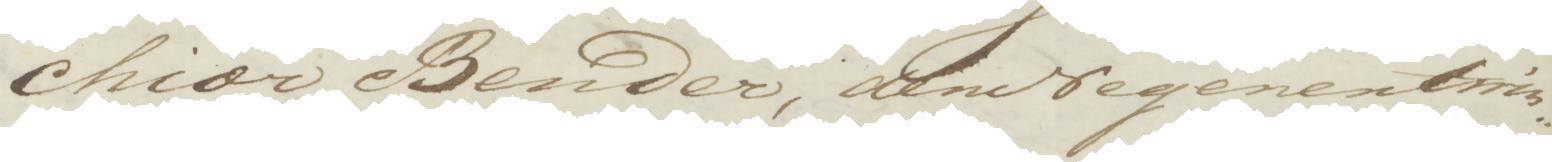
chior Bender, den negenentwin„
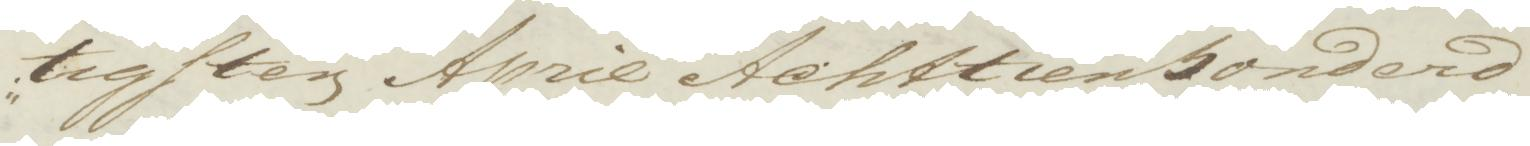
„tigsten April Achttienhonderd
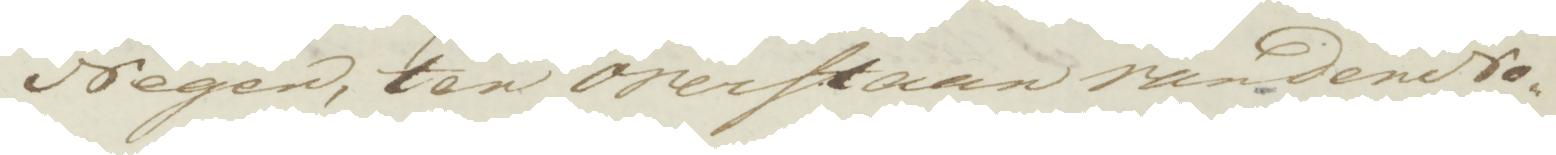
Negen, ten overstaan van den No„
